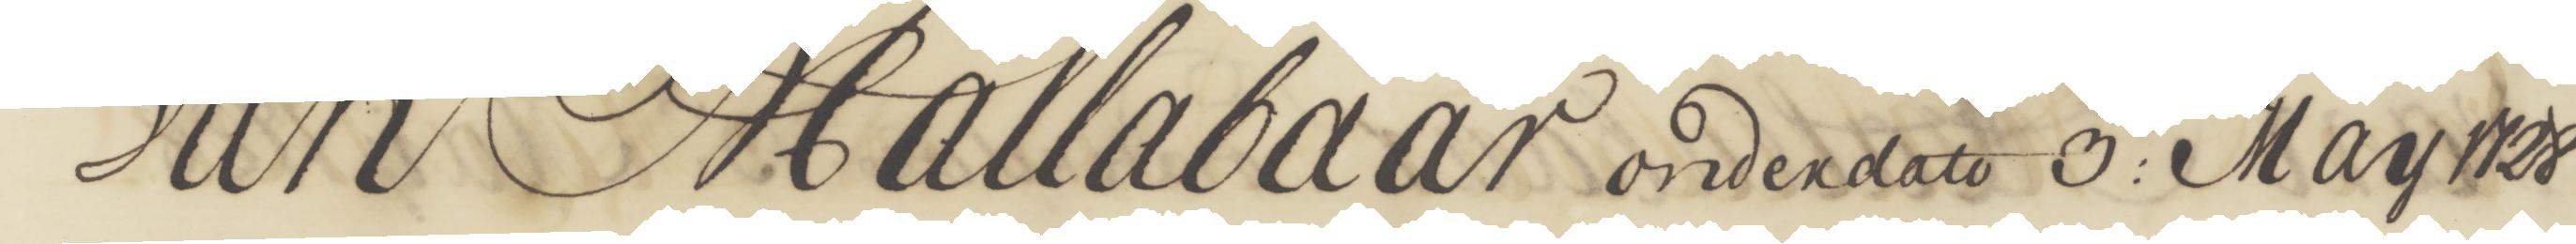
Van Mallabaar onder dato 3:' May 1728
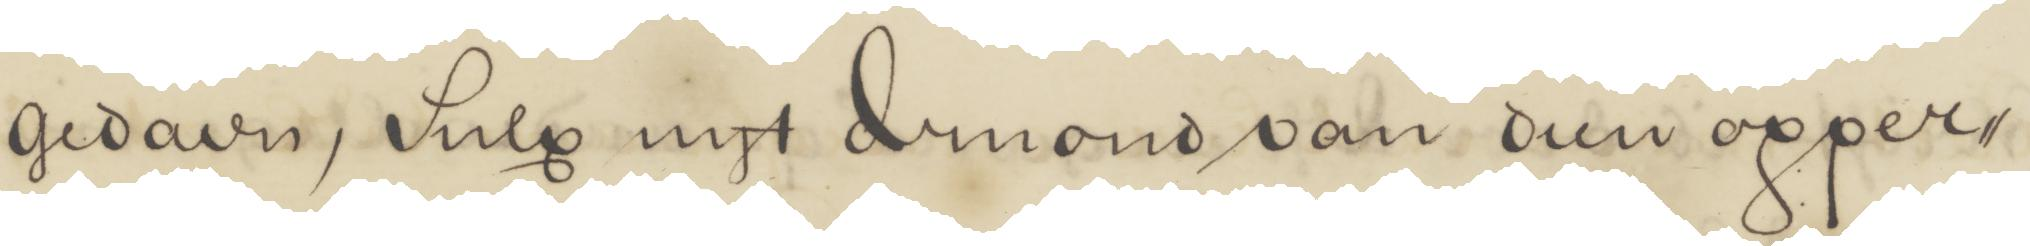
gedaen, sulx uyt demond van dien opper„
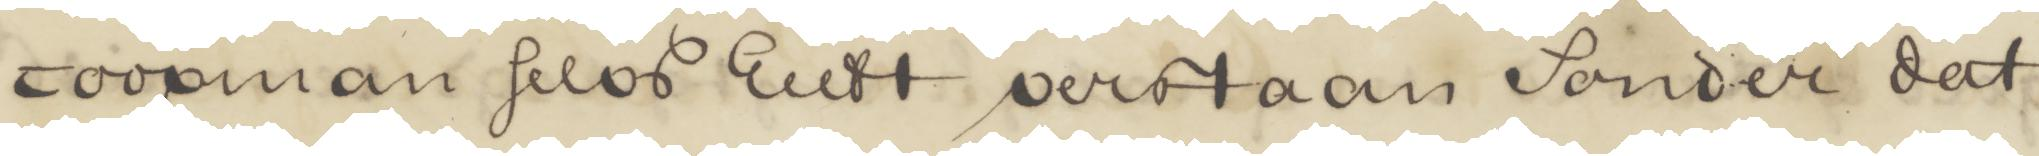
coopman selvs heeft verstaan sonder dat
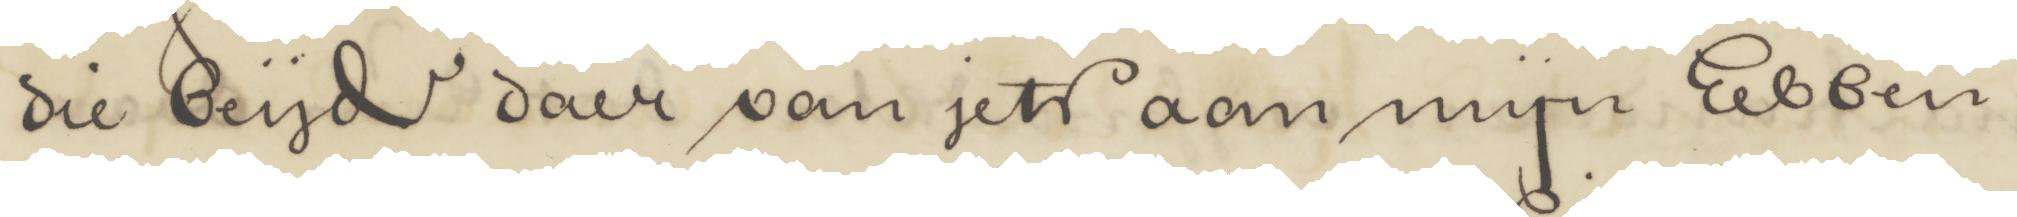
die beijde daer van jets aan mijn hebben
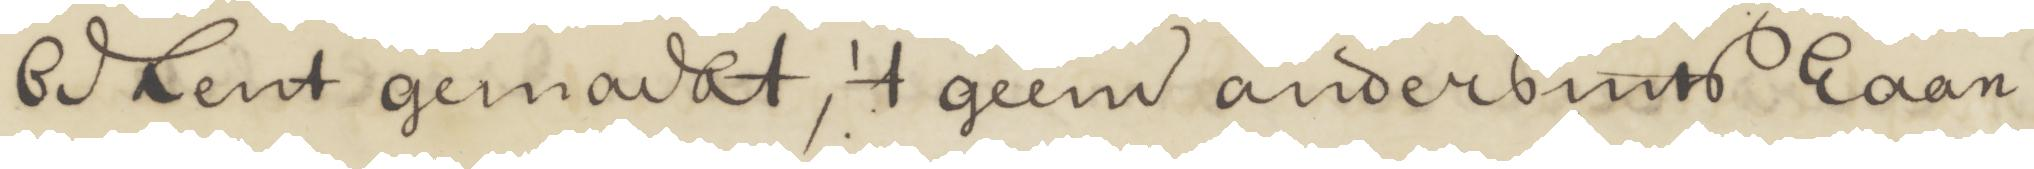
bekent gemaekt, ’t geene andersints haar
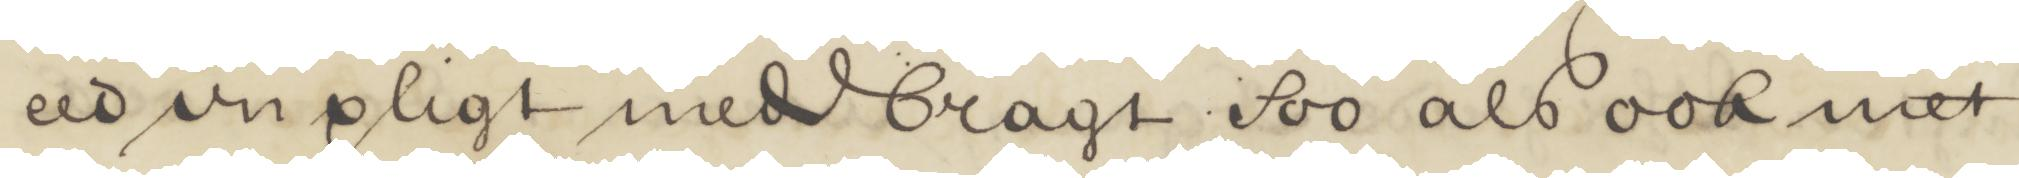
eed en pligt medebragt soo als ook niet
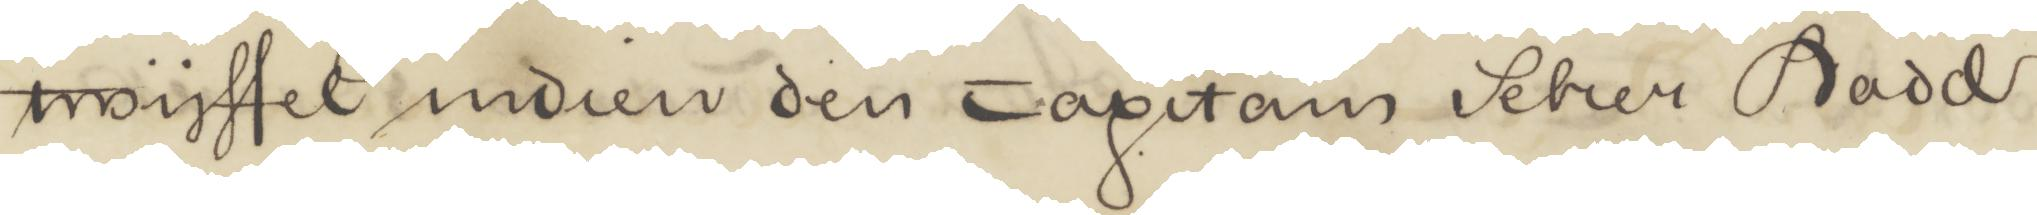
twijffel indien den capitain seker Hadde
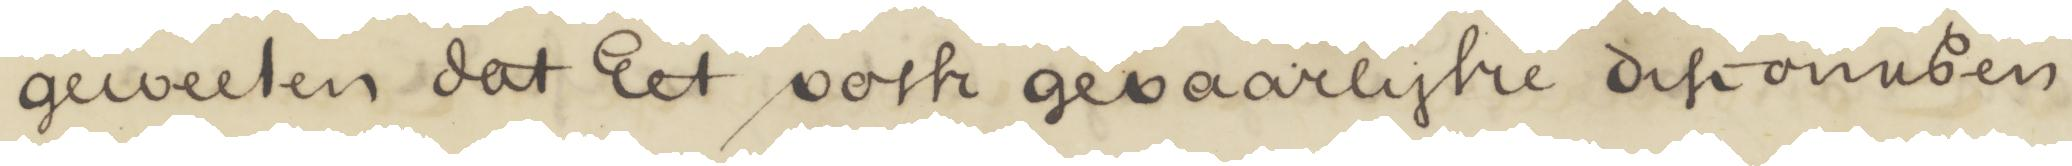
geweeten dat het volk gevaarlyke discoursen
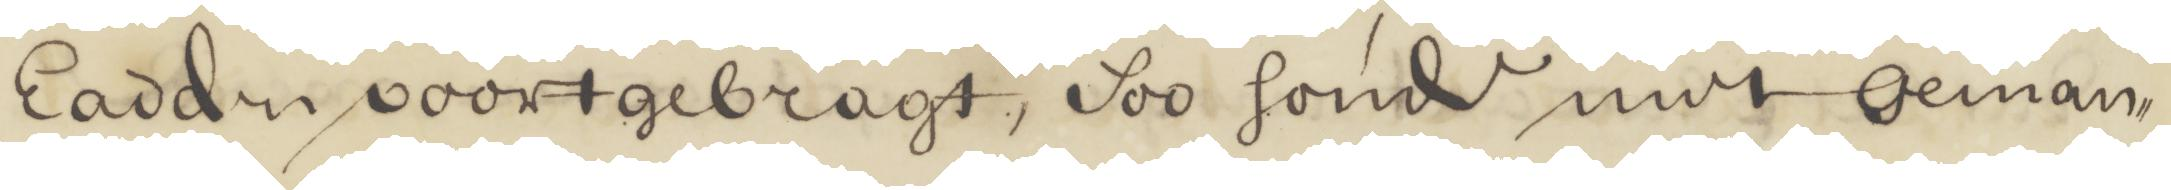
hadden voortgebragt, soo soude niet geman„
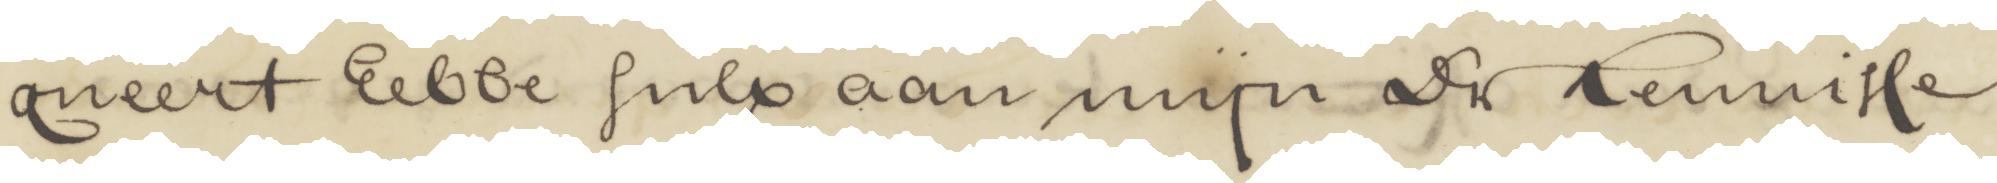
queert hebbe sulx aan mijn ter kennisse
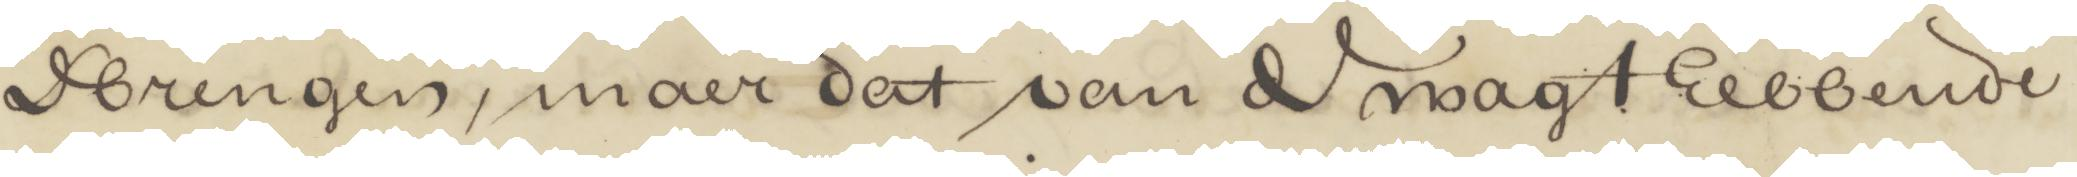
tebrengen, maer dat van de wagt hebbende
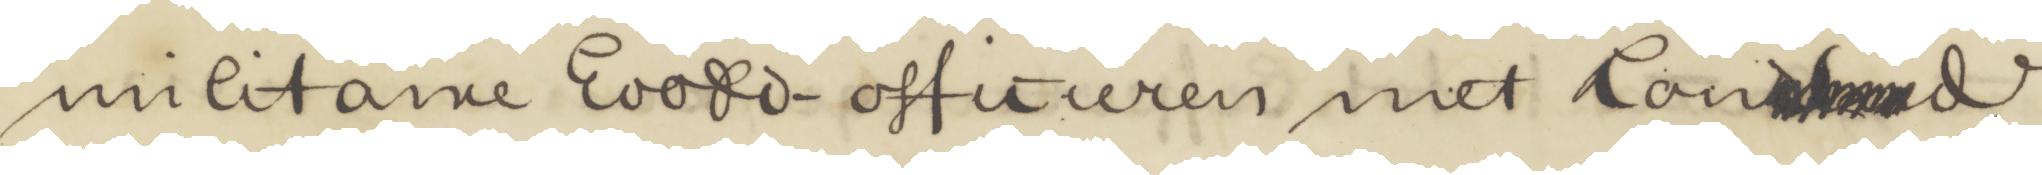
militaire hoofd-officieren niet kondtende
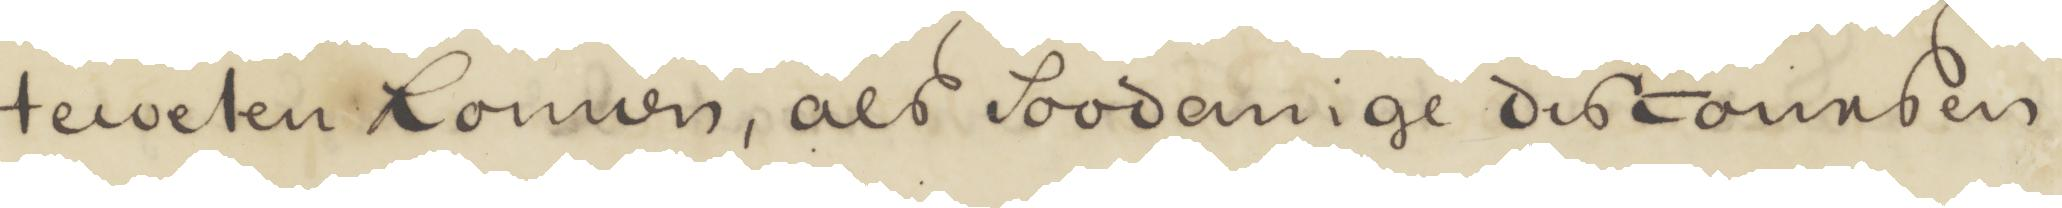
teweten komen, als soodanige discoursen
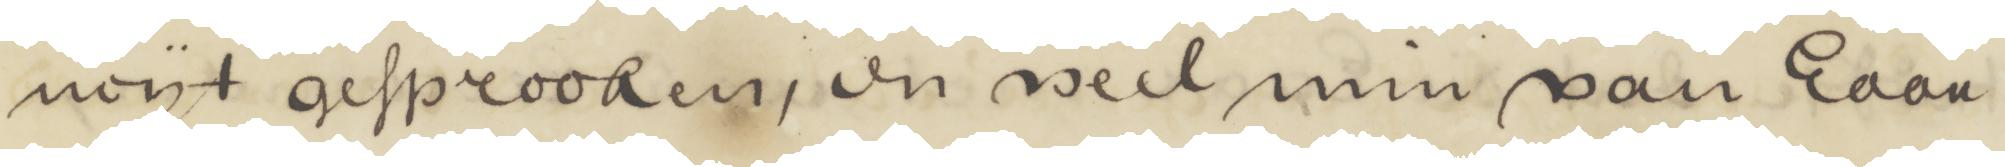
noijt gesprooken, en veel min van haar
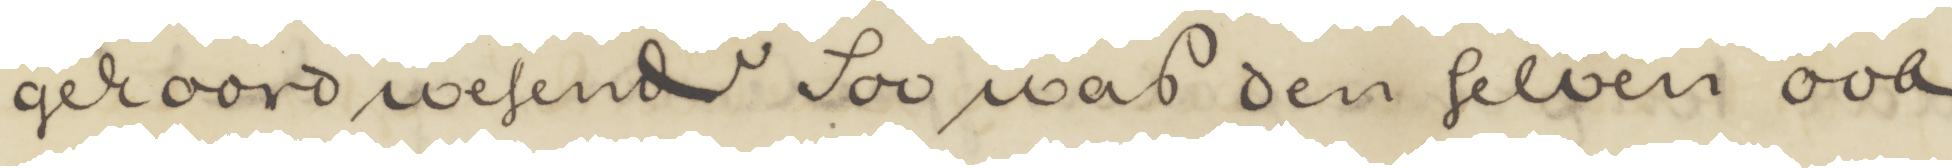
gehoord wesende soo was den selven ook
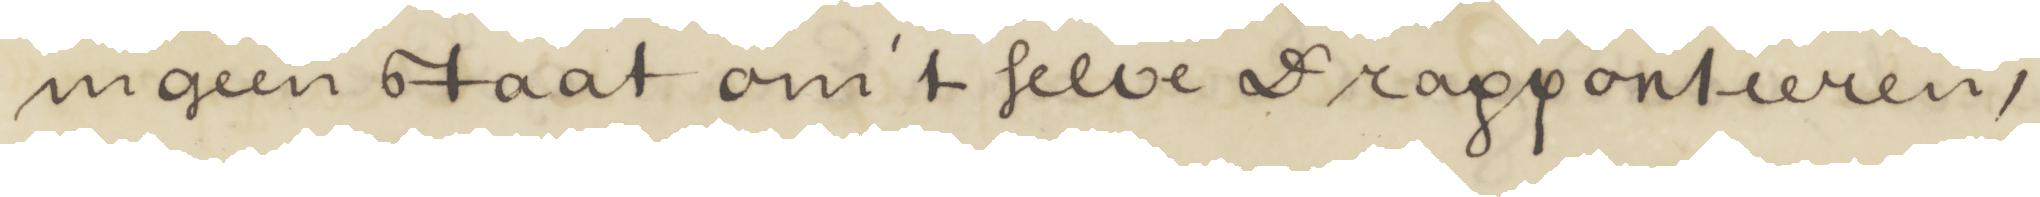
in geen staat om ’t selve te rapportieren,
